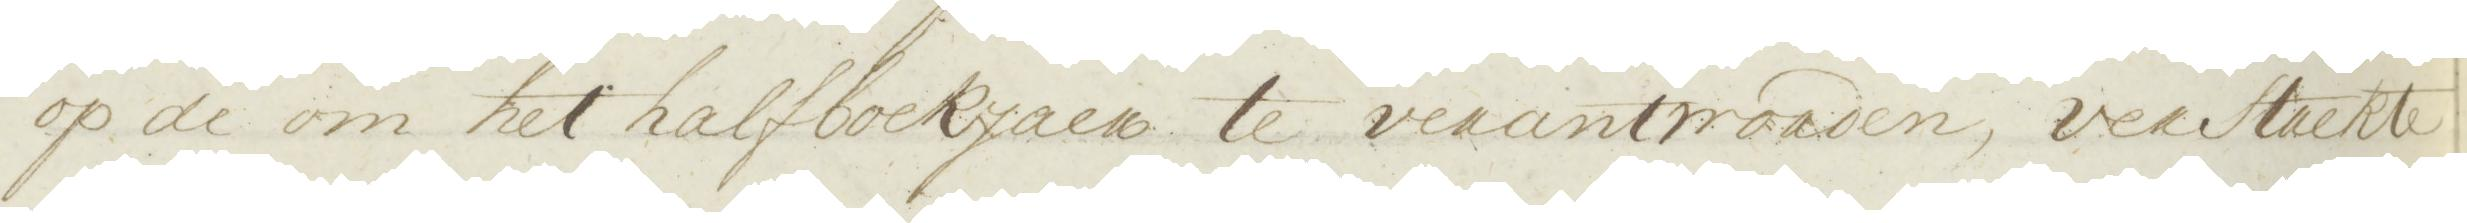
op de om het halfboekjaer te verantworden, verstrekte
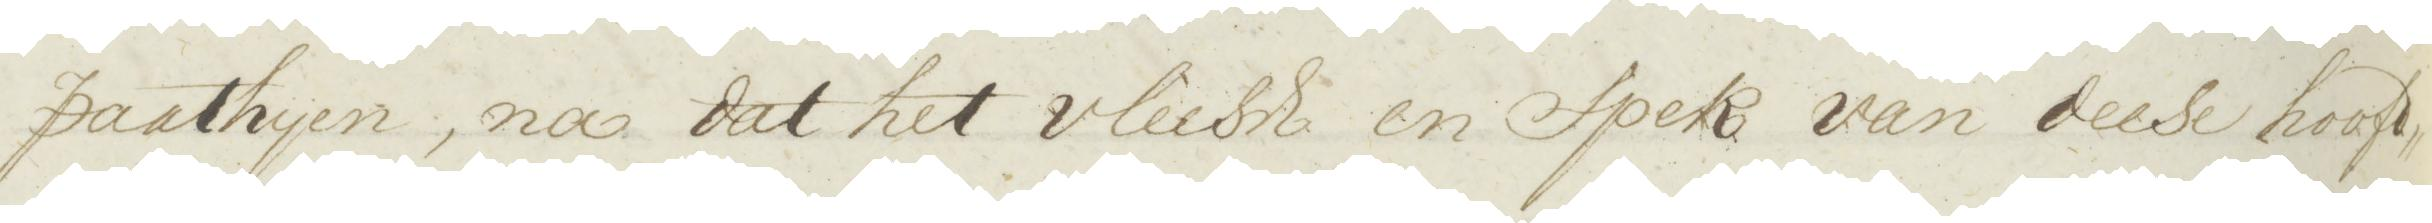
parthijen, na dat het vleesch en spek van deese hoofd„
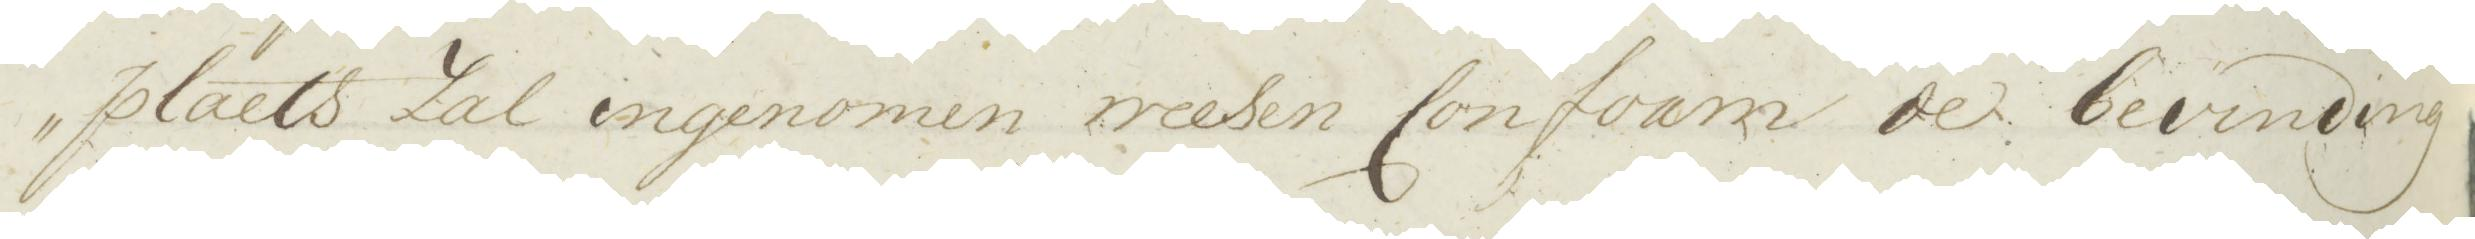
„plaets zal ingenomen weesen Conform de bevinding
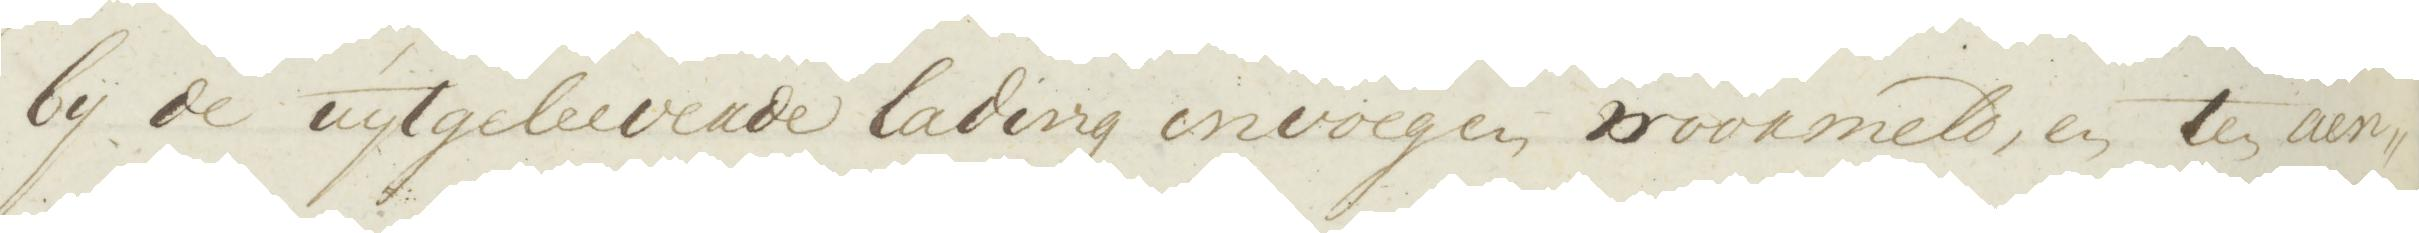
bij de uijtgeleeverde lading invoegen voormeld, en ten aen„
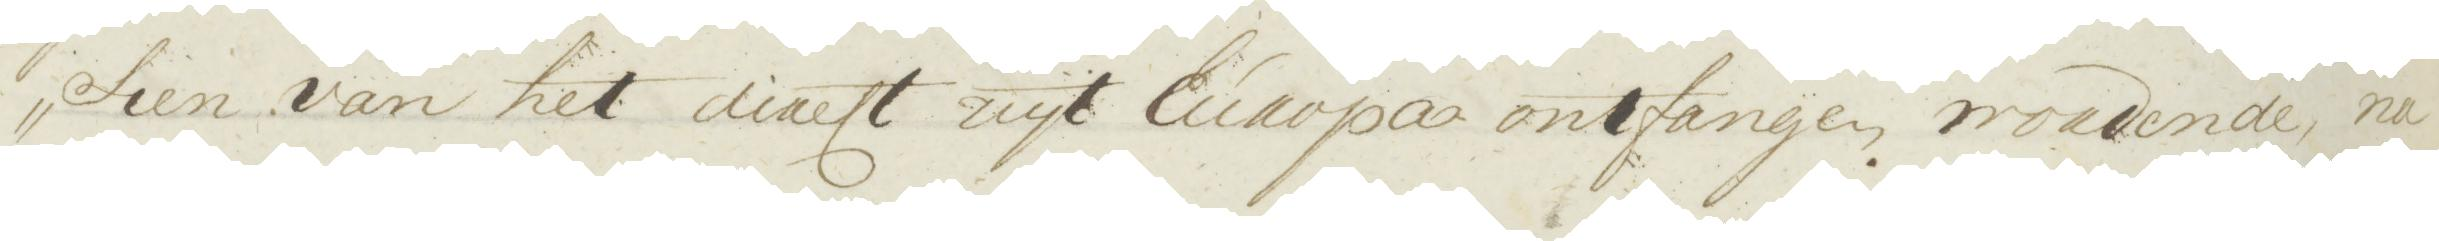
„sien van het direct uijt Europa ontfangen, wordende, na
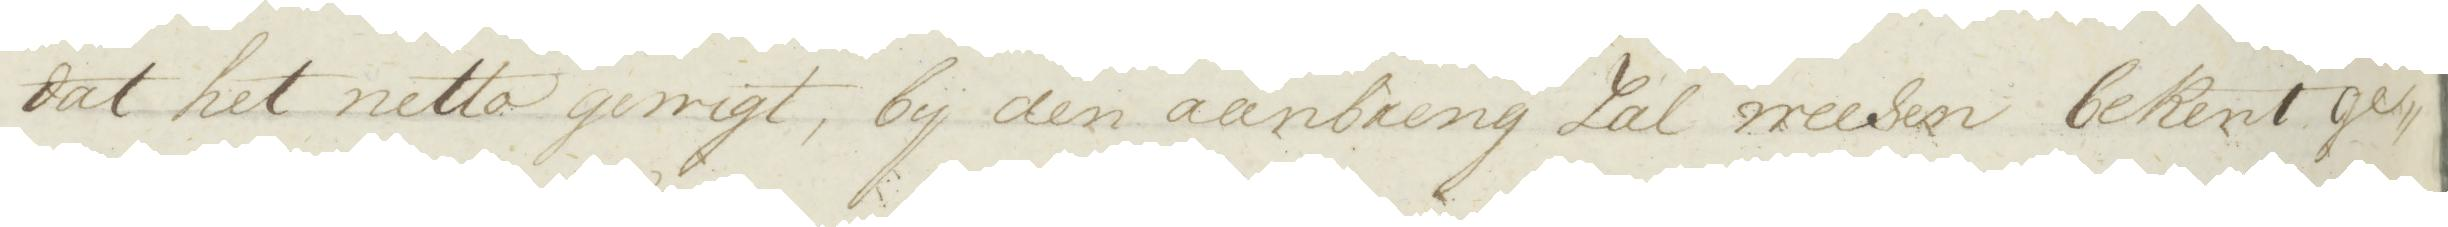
dat het netto gewigt, bij den aanbreng zal weesen bekent ge„
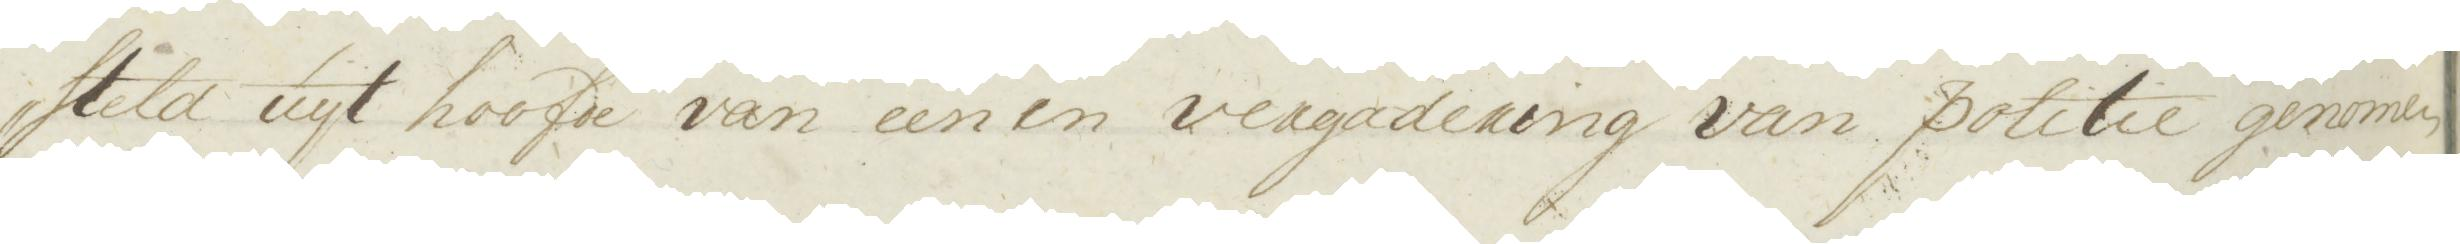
steld uijt hoofde van een in vergadering van politie genomen
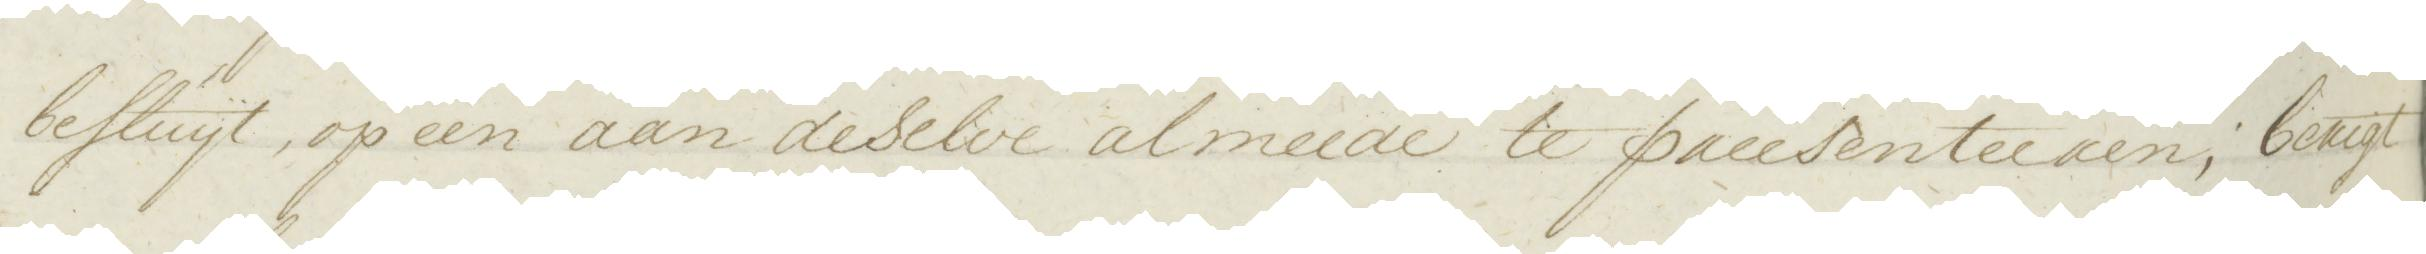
besluijt, op een aan deselve almeede te preesenteeren; berigt
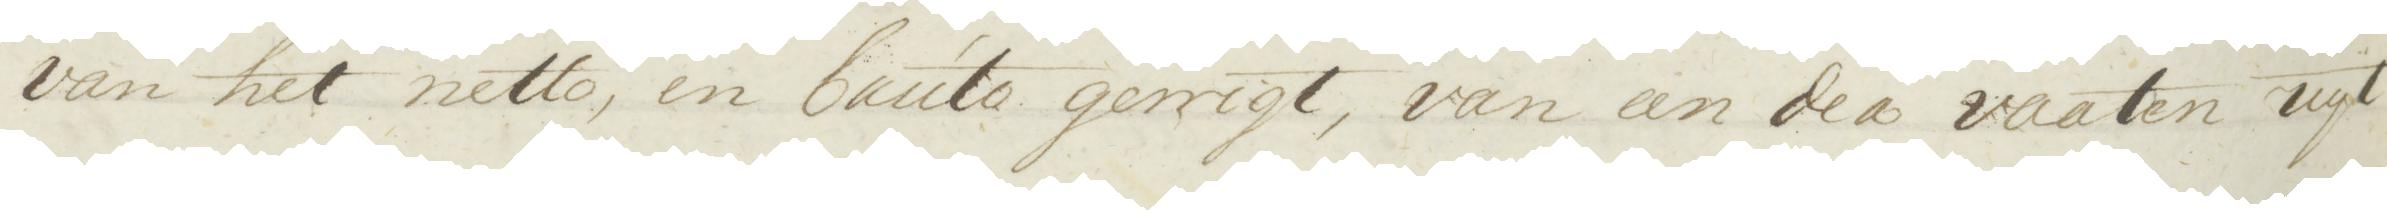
van het netto, en bruto gewigt, van een der vaaten uijt
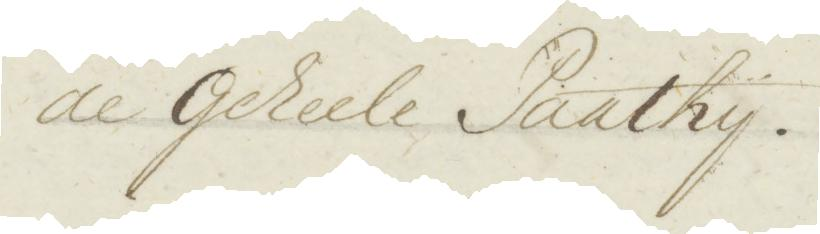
de geheele Parthij.
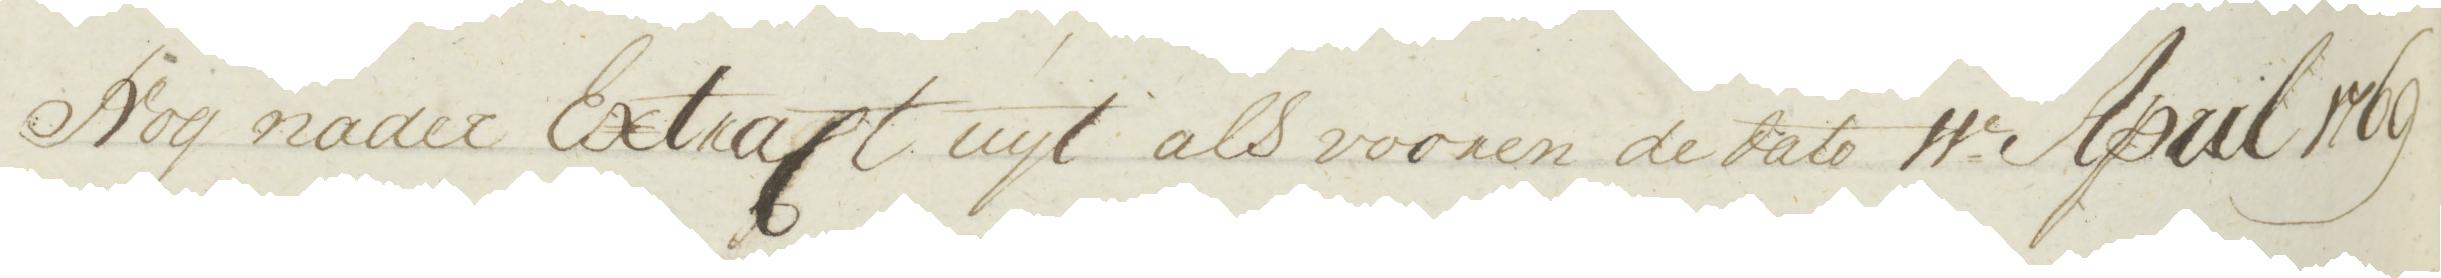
Nog nader Extract uijt als vooren de dato 11:e April 1769
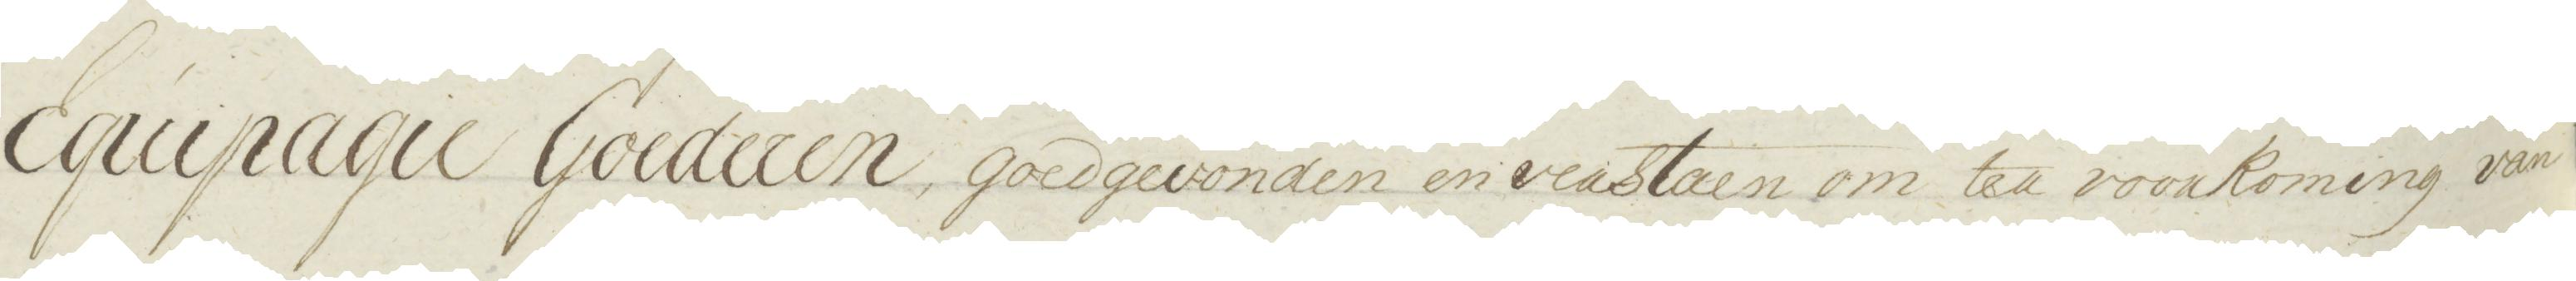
Equipagie Goederen, goedgevonden en verstaen om ter voorkoming van
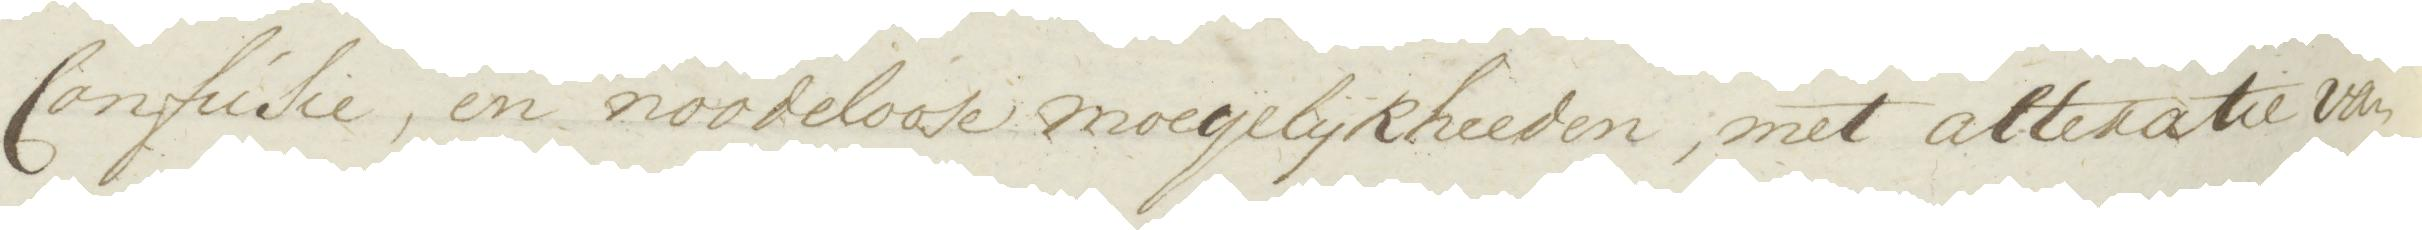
Confusie, en noodeloose moeijelijkheeden, met alteratie van
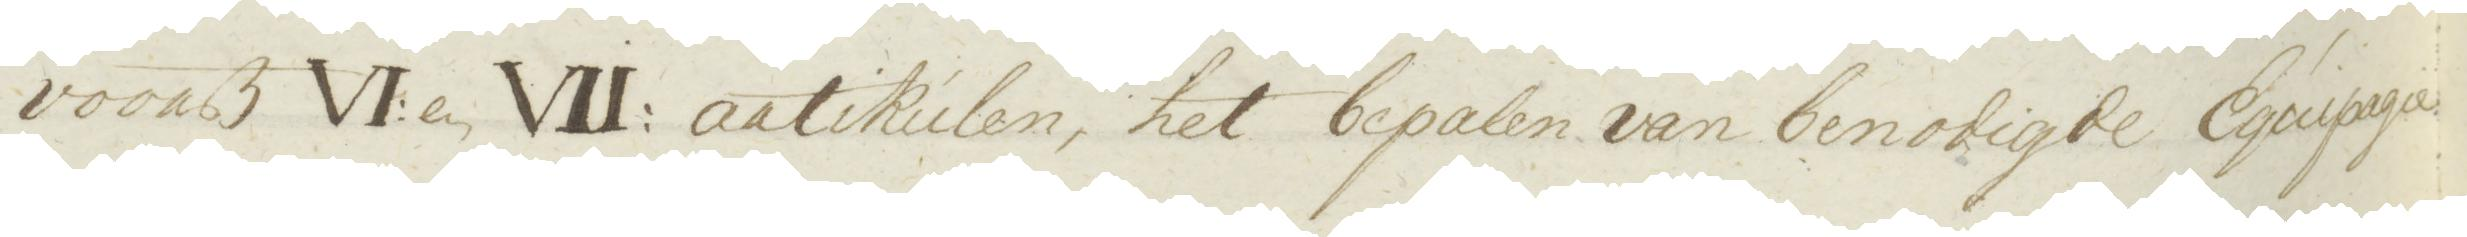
voorsz VI: en VII: artikulen, het bepalen van benodigde Equipagie
